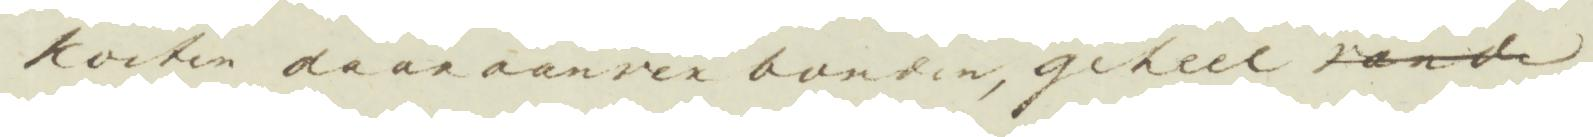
kosten daar aan ver bonden, geheel vande
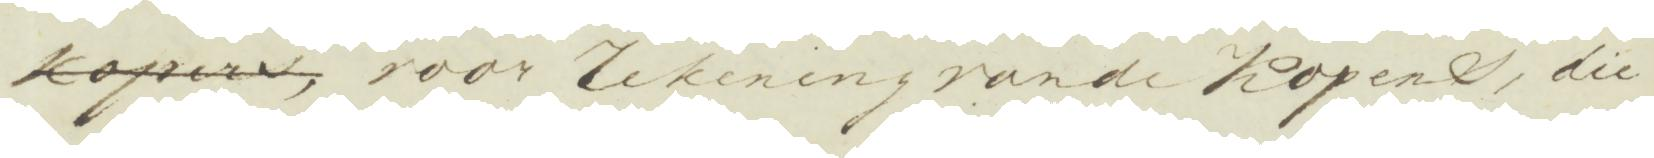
kopers, voor rekening van de Kopers, die
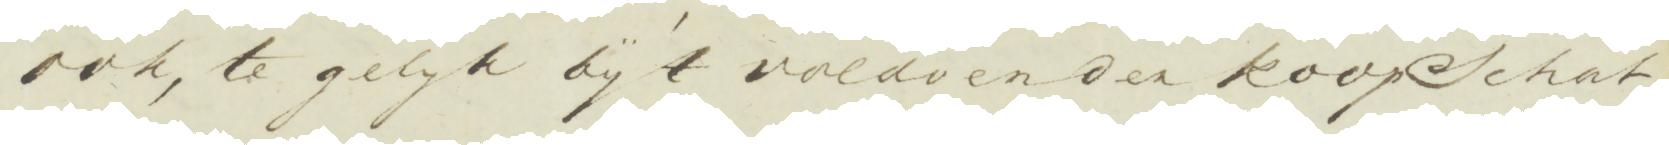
ook, te gelyk bij 't voldoen der koopSchat
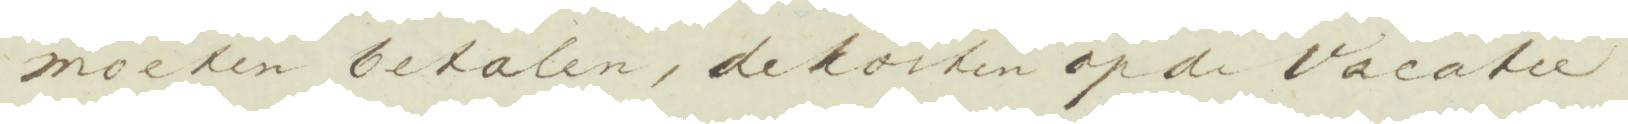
moeten betalen, de kosten op de Vacatie
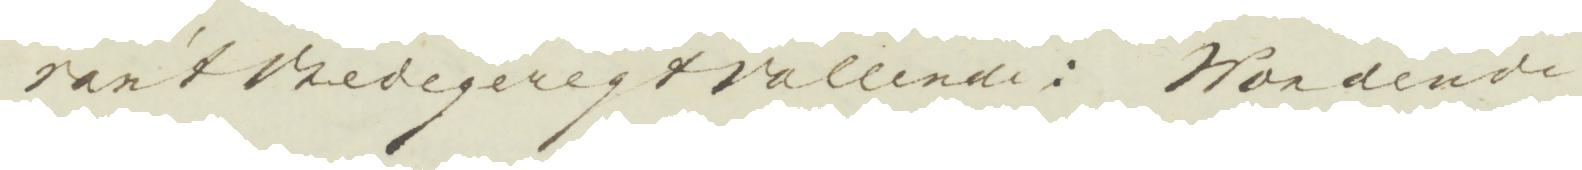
van ’t Vredegeregt vallende: Wordende
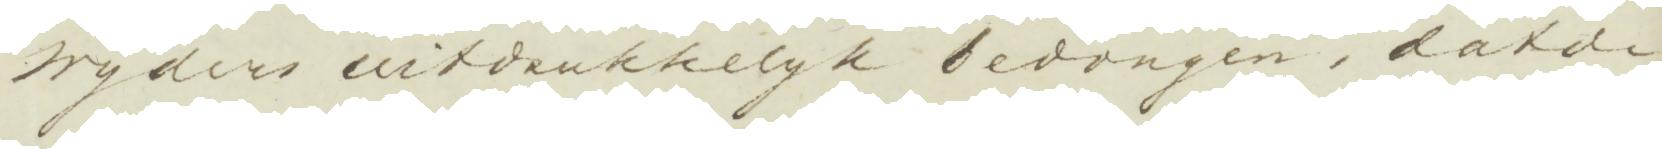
wyders uitdrukkelyk bedongen, dat de
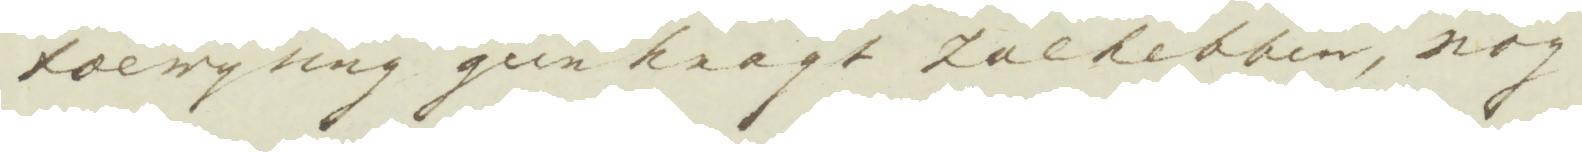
toewysing geen kragt zal hebben, nog
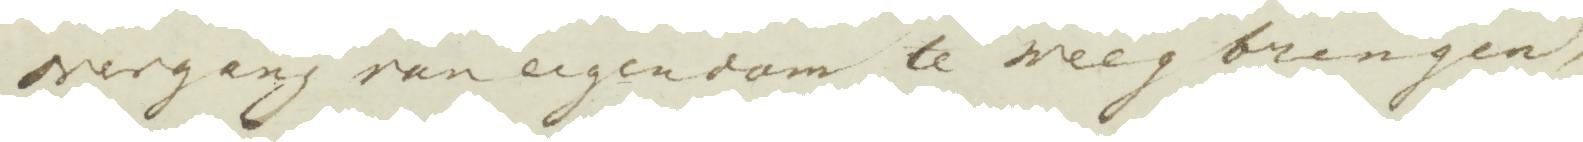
overgang van eigendom te weeg brengen,
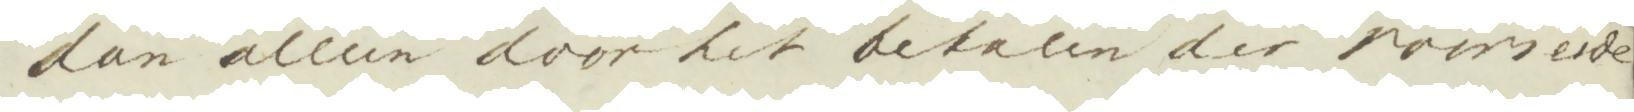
dan alleen door het betalen der voorseide
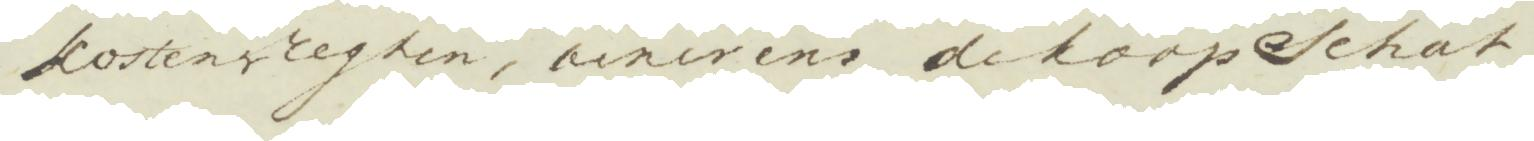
kosten en regten, benevens de koop Schat
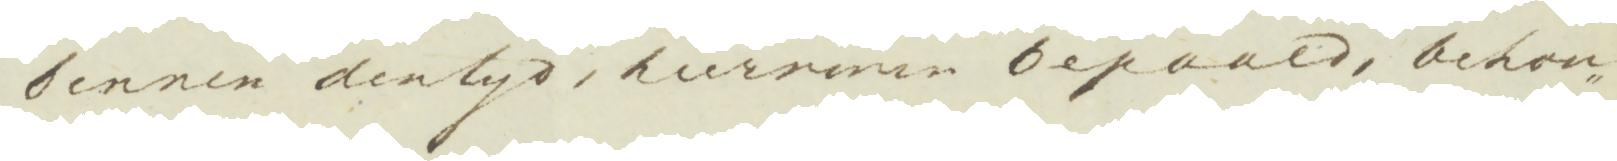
binnen den tyd, hiervoren bepaald, behou„
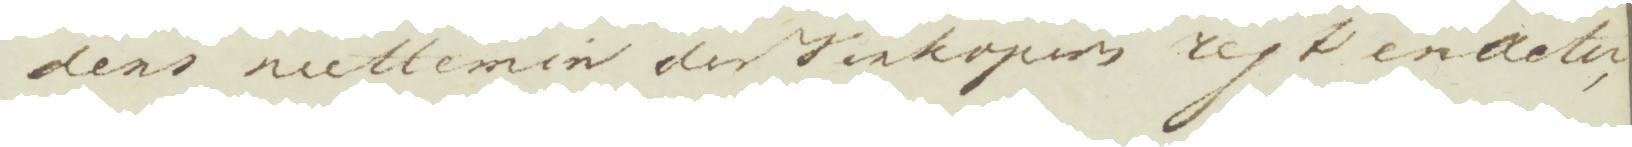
dens niettemin der Verkopers regt en acten,
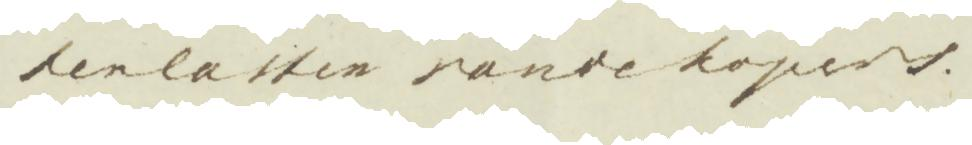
ten lasten van de kopers.
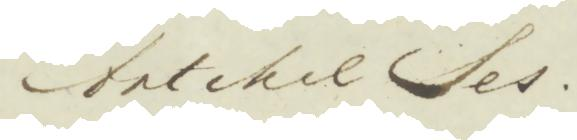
Artikel Ses.
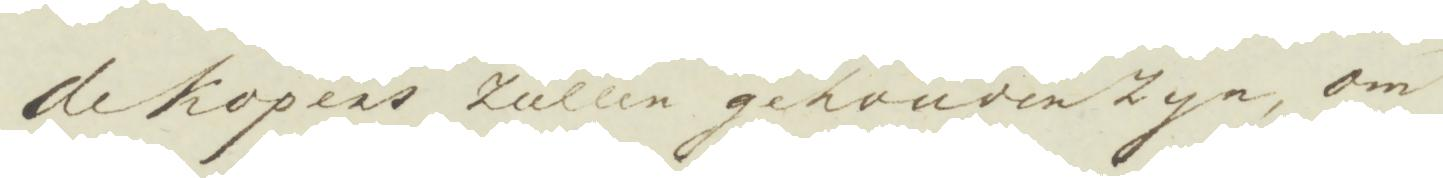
de kopers zullen gehouden zyn, om
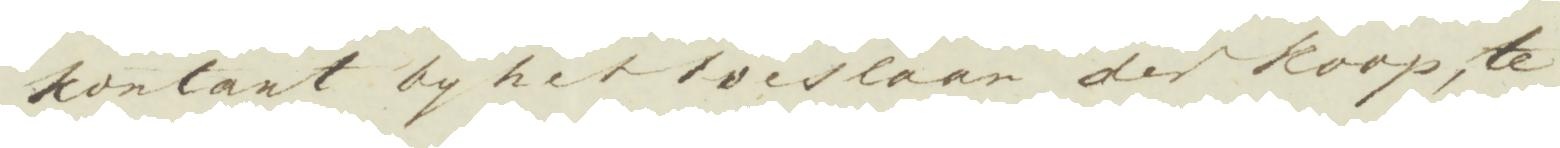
kontant by het toeslaan der koop, te
